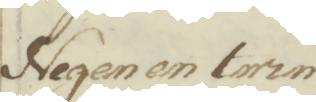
Negen en twin
